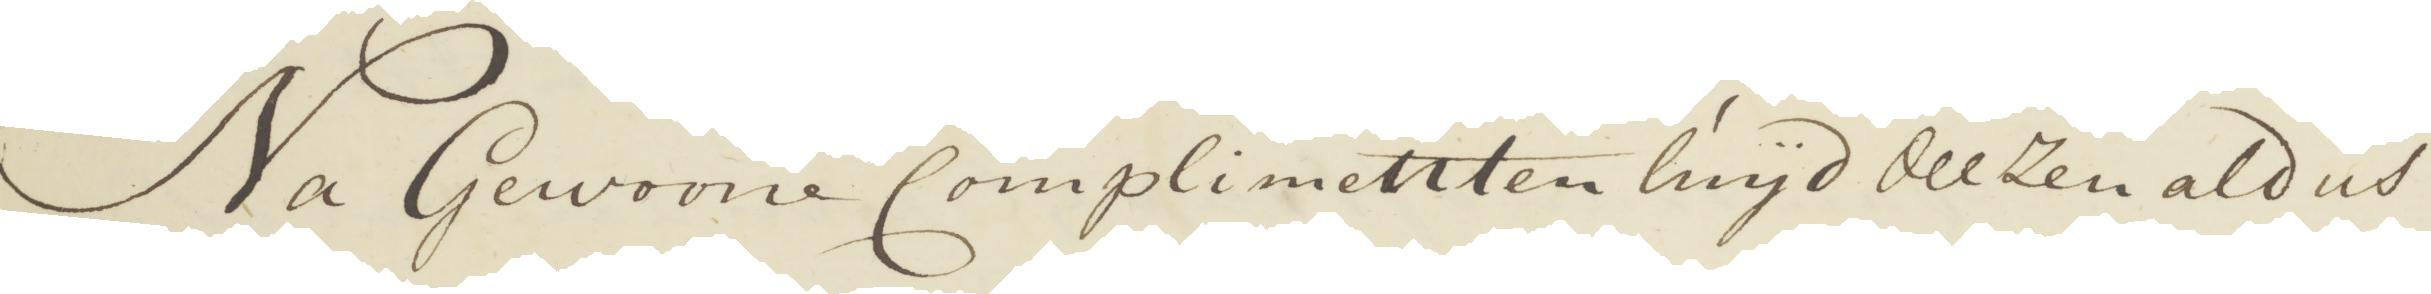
Na Gewoone Complimenten luijd deezen aldus
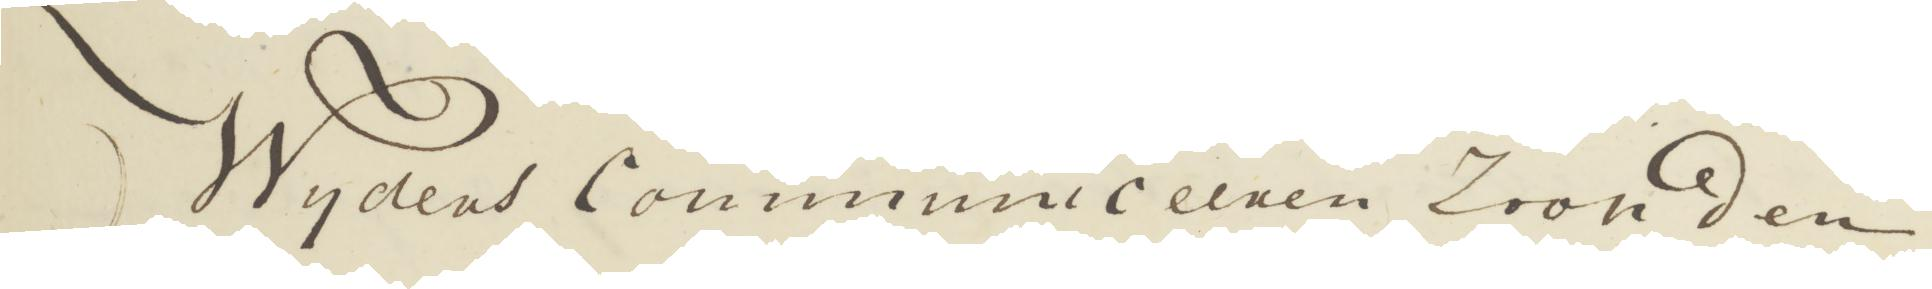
Wyders communiceeren zoon den
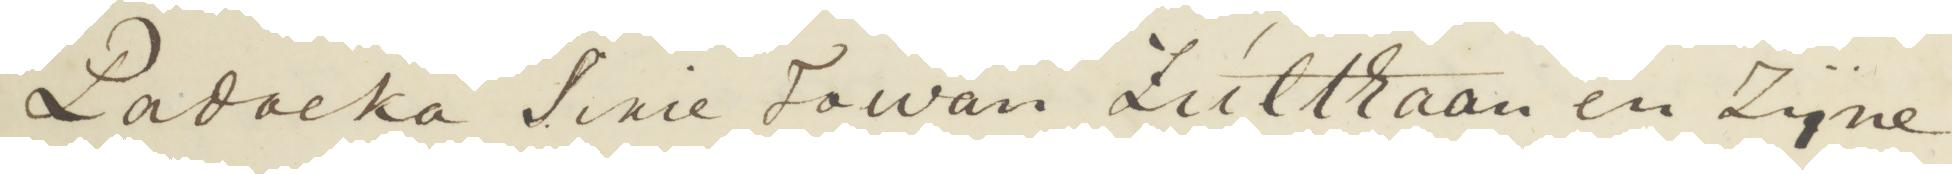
Padoeka sirie Towan zulthaan en zijne
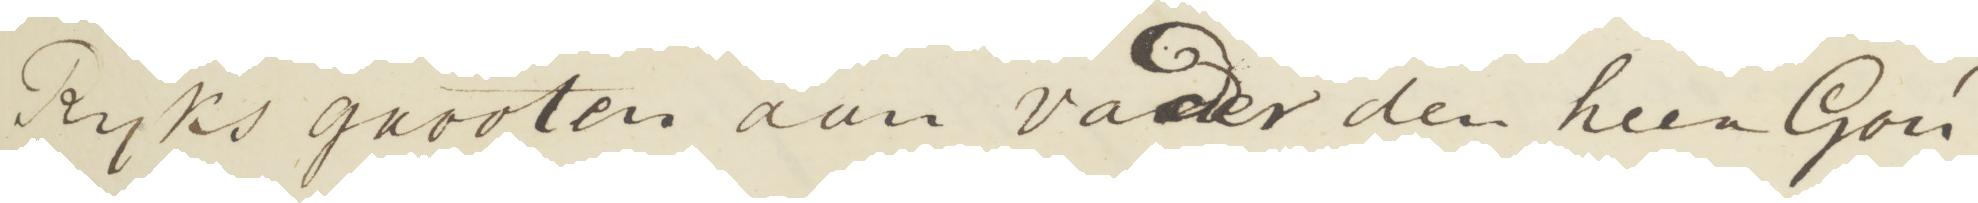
Ryks grooten aan vader den heer Gou
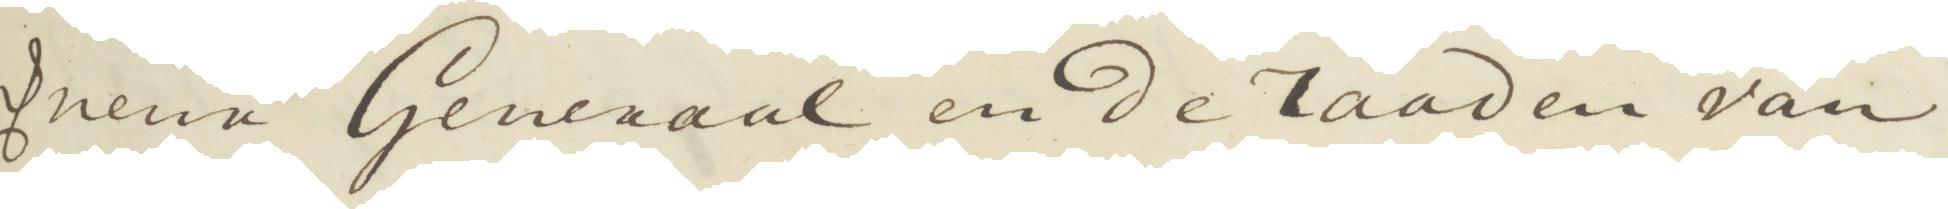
verneur Generaal en de raaden van
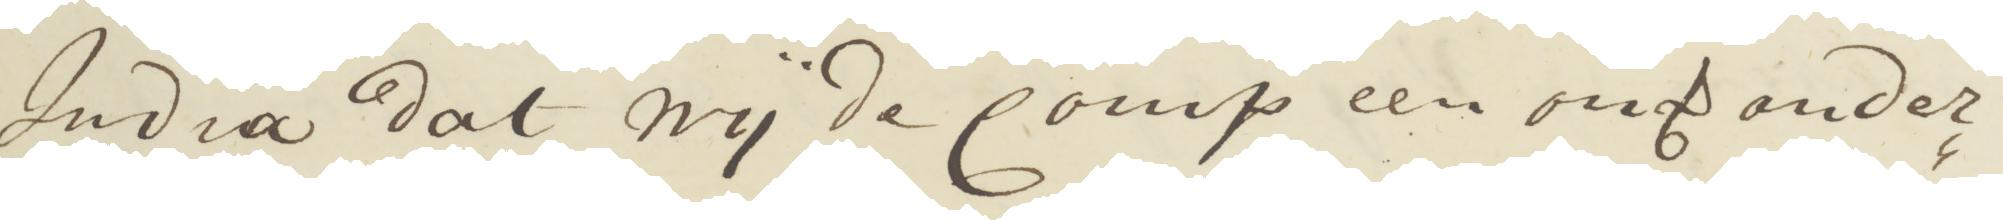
India dat wij de Comp een onverander„
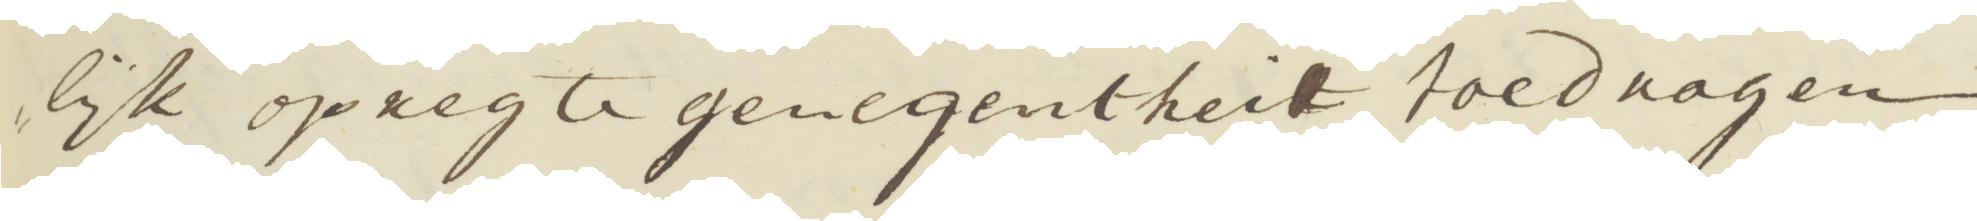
„lijk opregte genegentheit toedragen
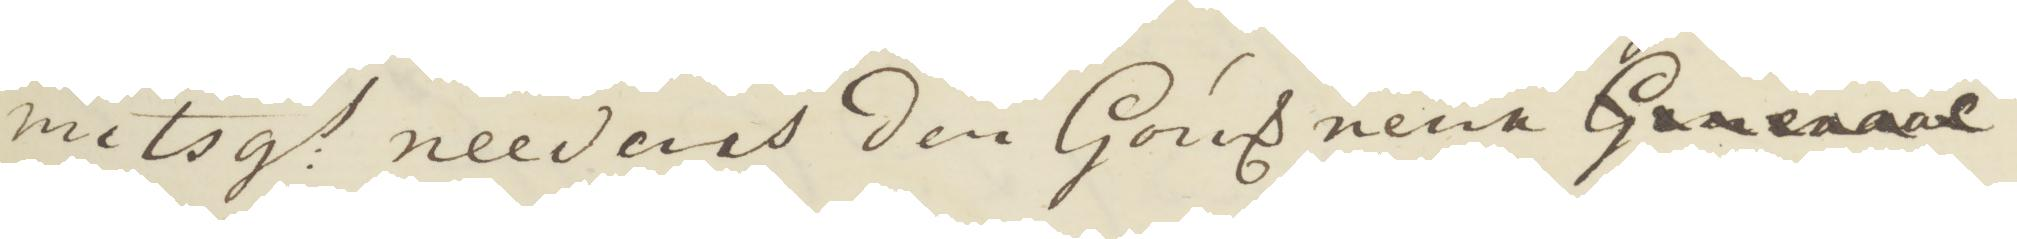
mitsg:s neevens den Gouverneur Generaal
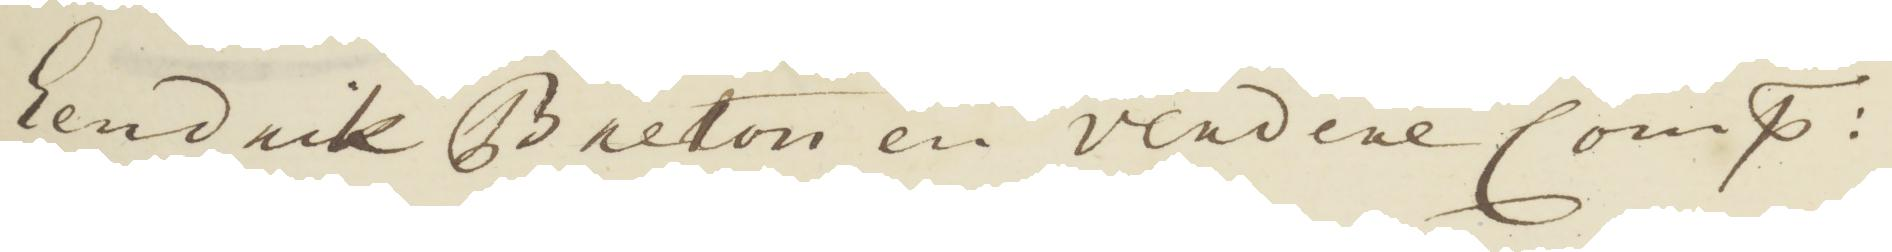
hendrik Breton en verdere Comp:
